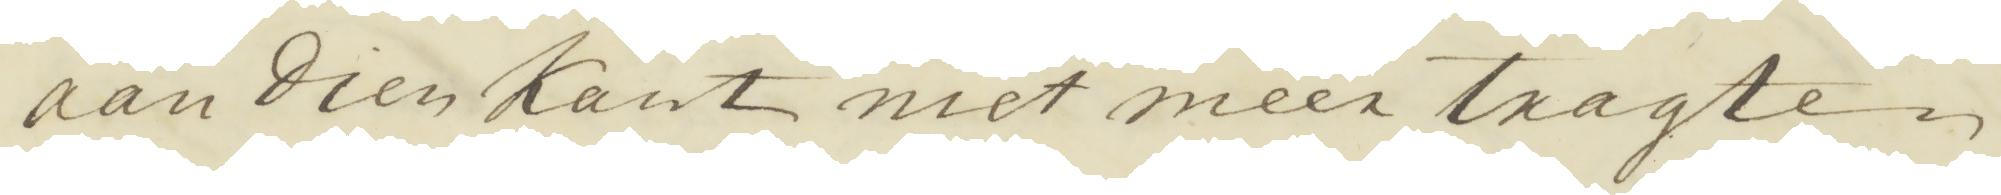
aan dien kant niet meer tragten
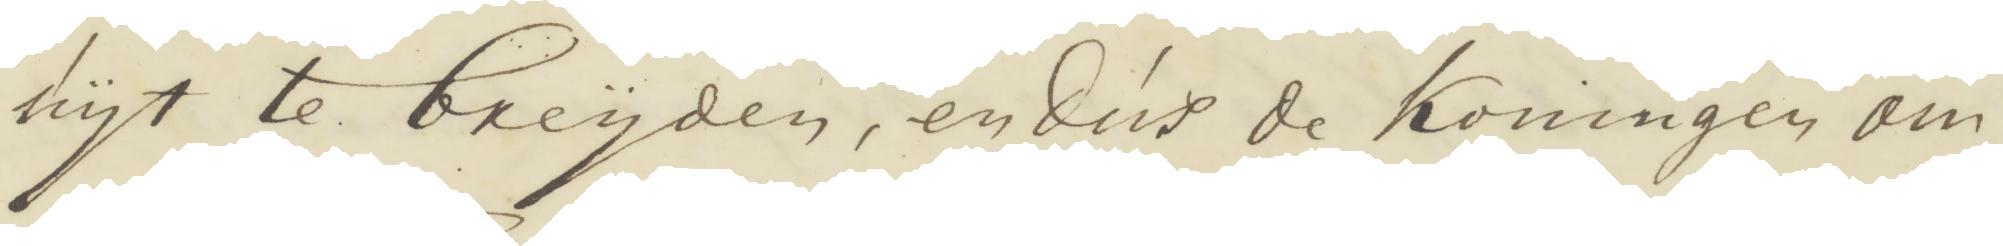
uijt te breijden, en dus de koningen om
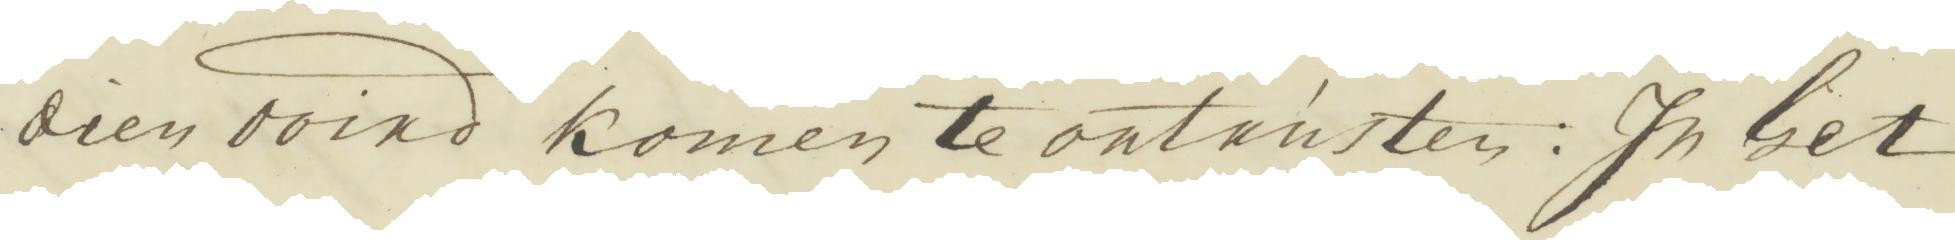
dien ooird komen te ontrusten: Jn het
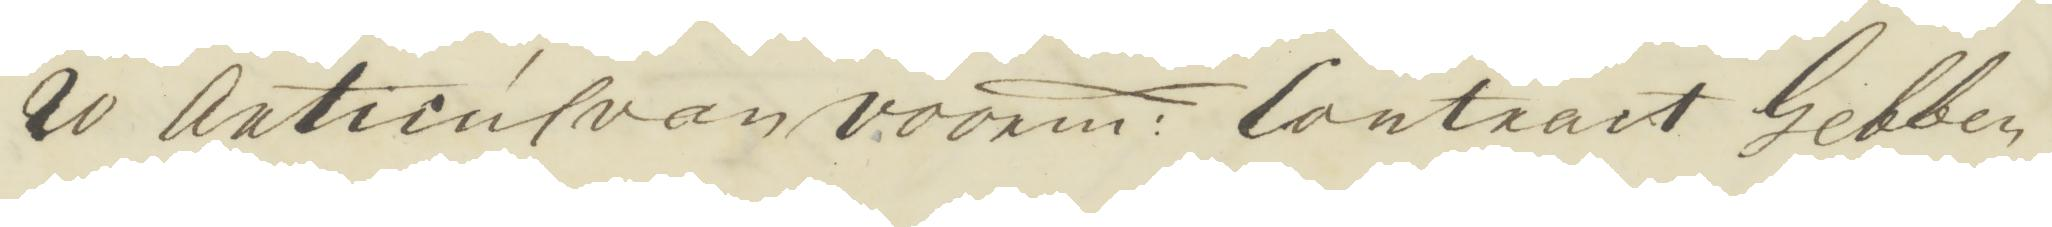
20 articul van voorm: Contract hebben
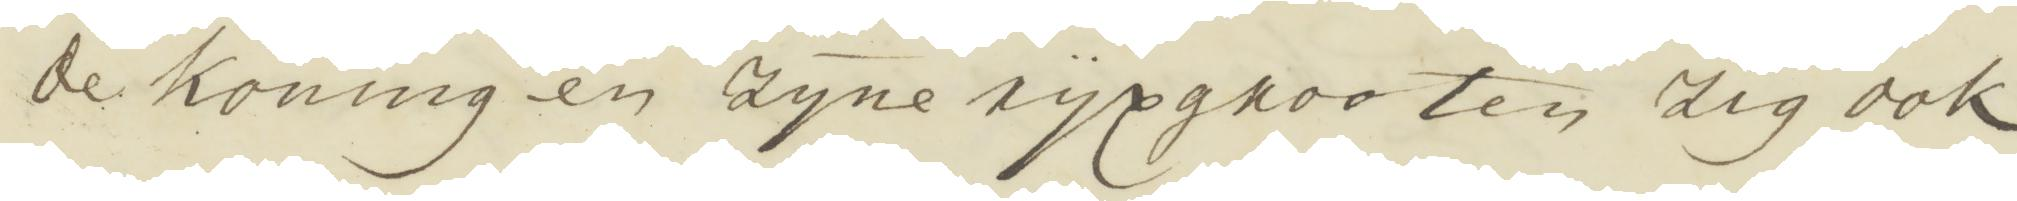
de koning en zijne rijxgrooten zig ook
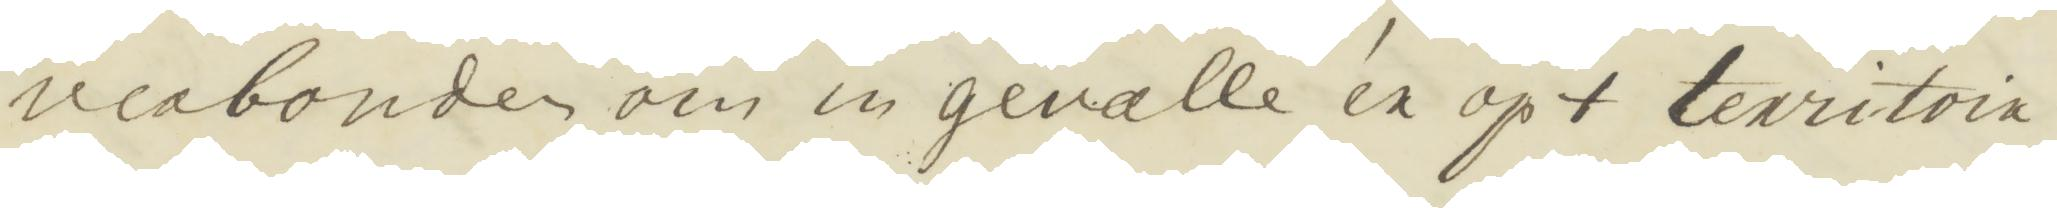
verbonden om in gevalle 'er op t territoir
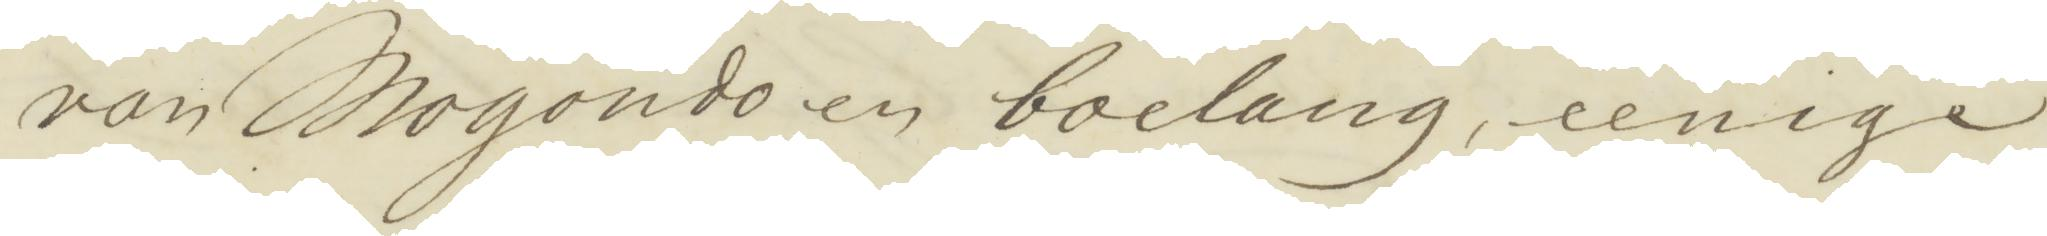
van Mogondo en boelang, eenige
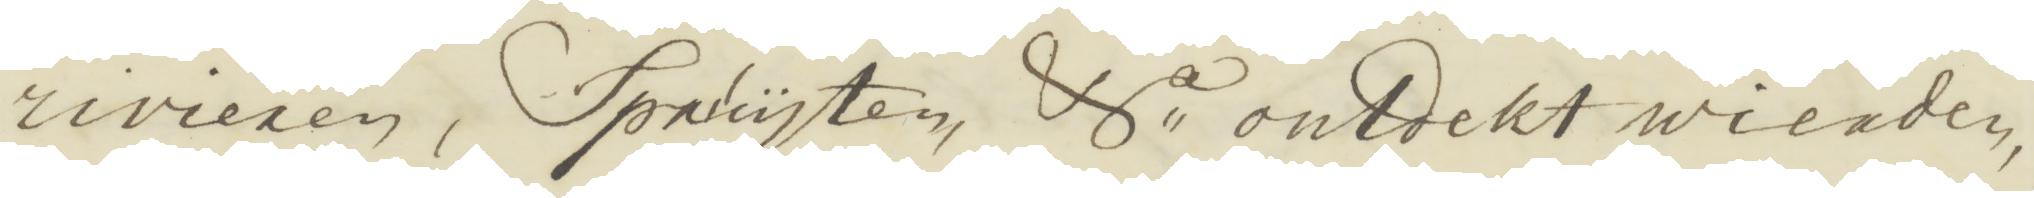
rivieren, spruijten, &„a ontdekt wierden,
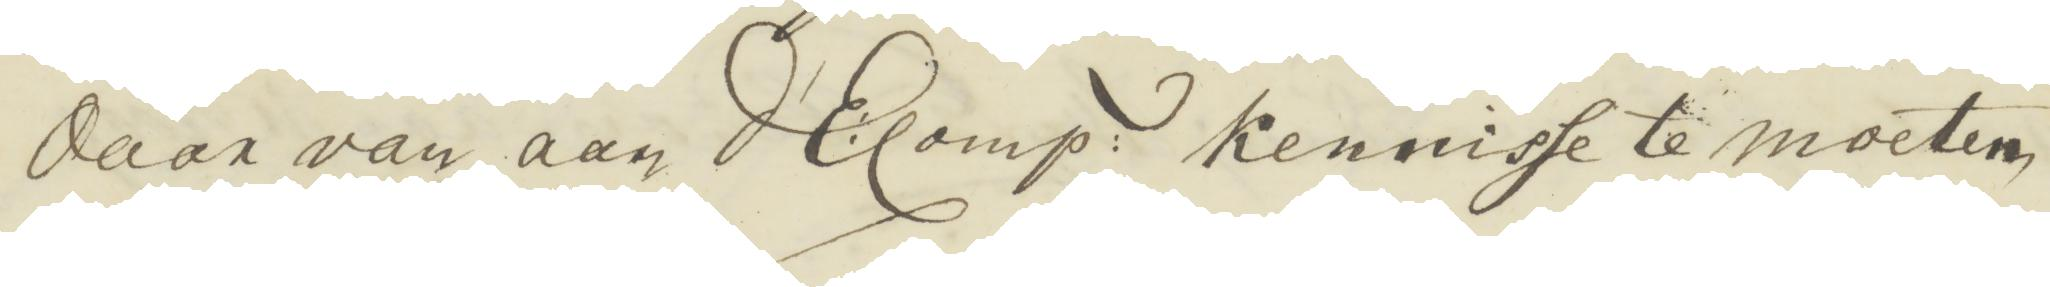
daar van aan d'EComp:s kennisse te moeten
